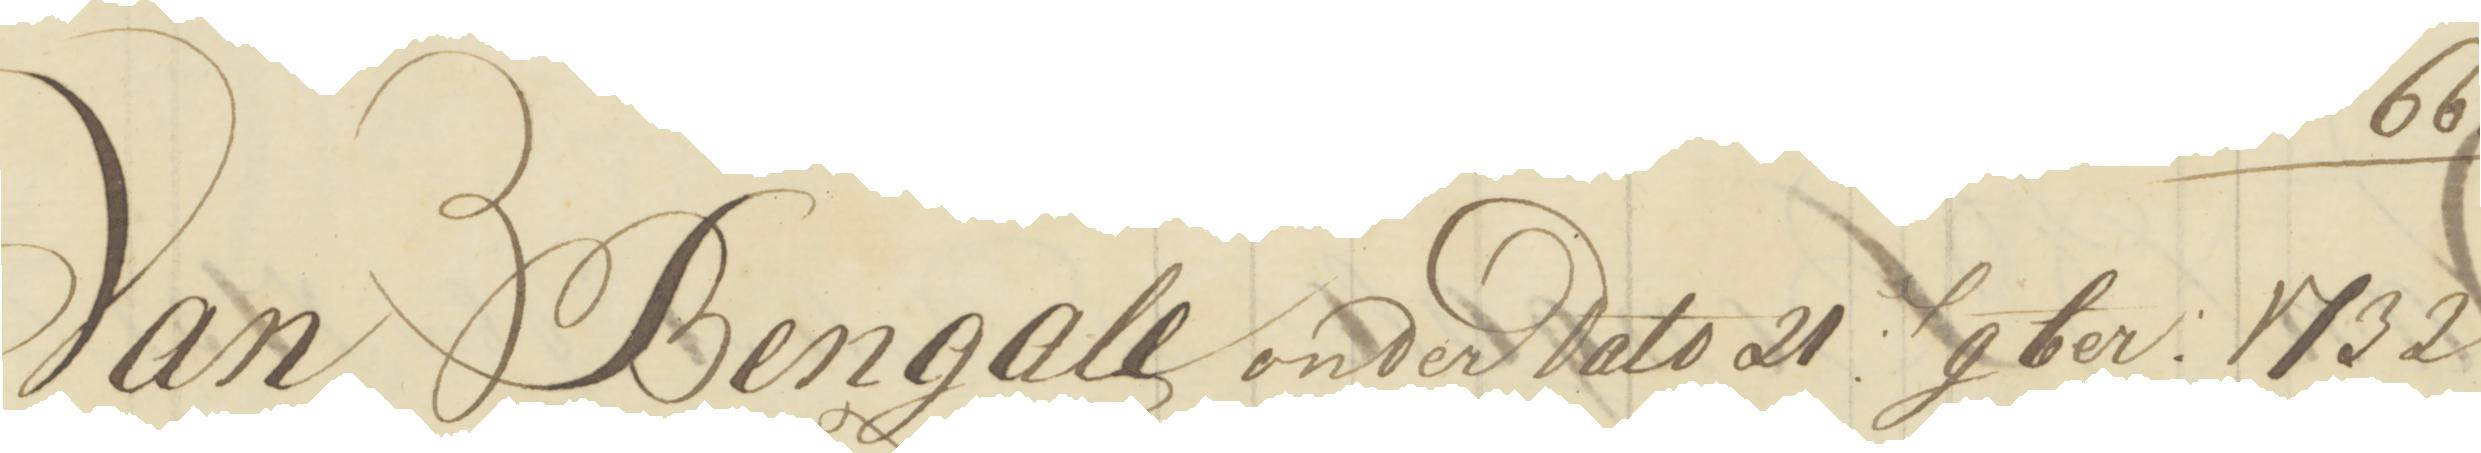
Van Bengale, onder dato 21:' 9ber: 1732.
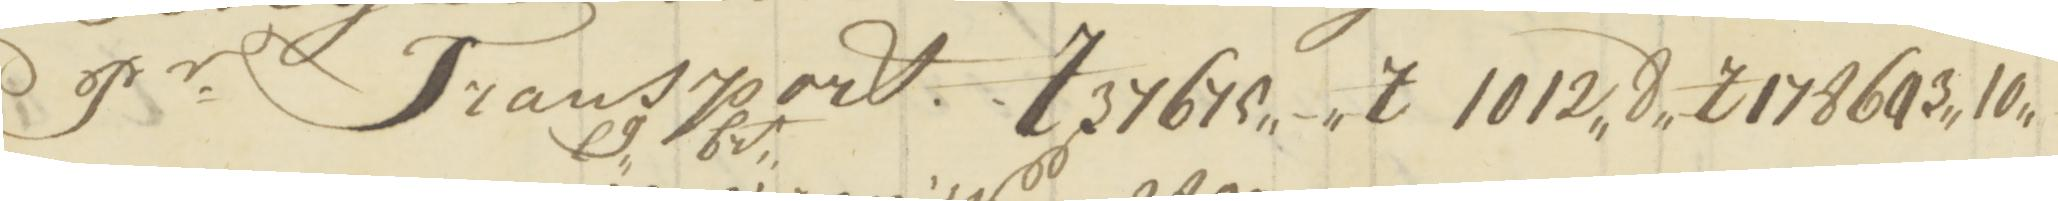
P=r Transport..r 37675„—„—r 1012„ 8„ r178643„10„
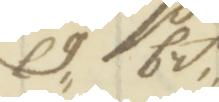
l„g„ br„t
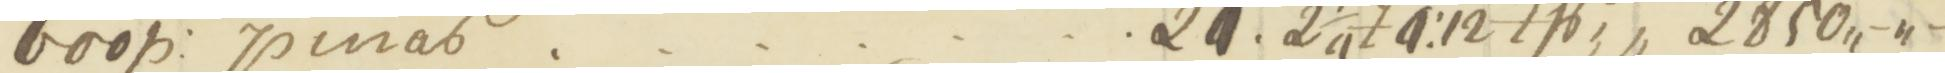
600 p:s pinas . - - . - . . 24. 2¼r4:12 rp„s „ 2850„—„
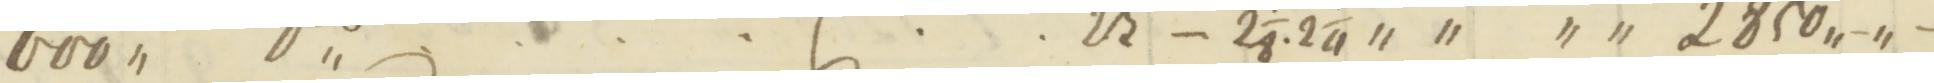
600„ d=o . . . . . . 23 — 2 1/8.2¼ „ „ „ „ 2850„—„
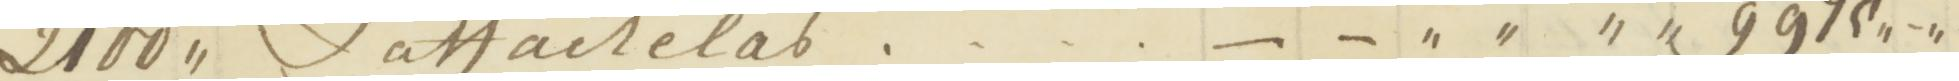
2100„ Taffachelas . - - . — — „ „ „ „ 9975„—„
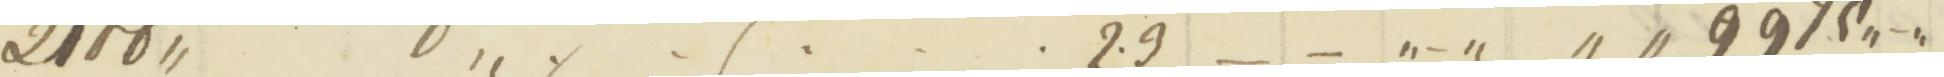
2100„ d„o . - . - . 2.3 — — „—„ „ „ 9975„—„
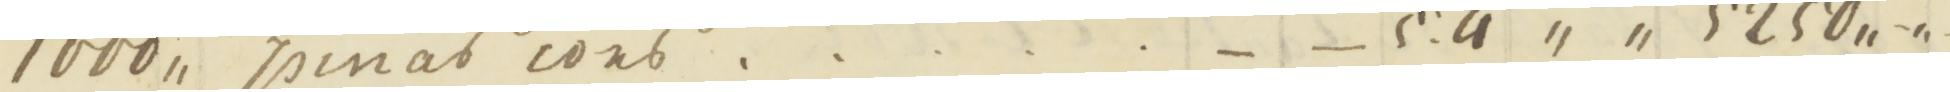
1000„ pinas cors . . . . . — — 5: 4 „ „ 5250„—„
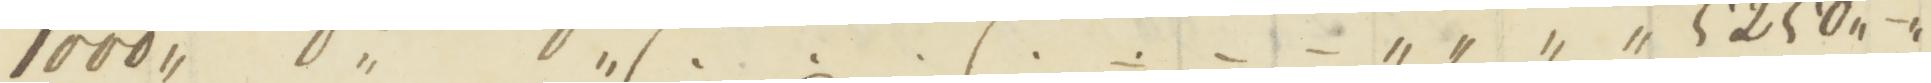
1000„ d„o d„o . . . . . — — „ „ „ „ 5250„—„
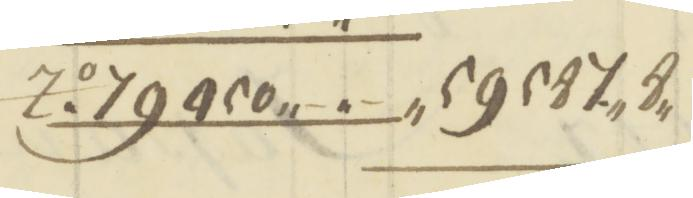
r.o 79450„— „— „59587„ 8„
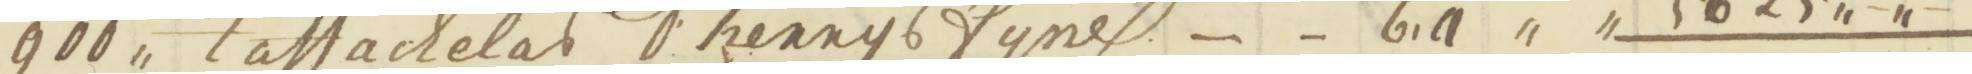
900„ taffachelas d' herrijs fijne. — — 6.4 „ „ 5625„— „
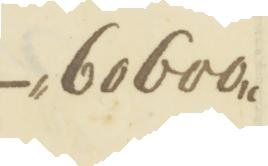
„60600„
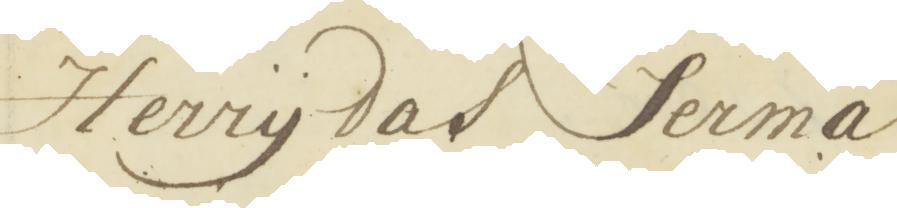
Herrij das Serma
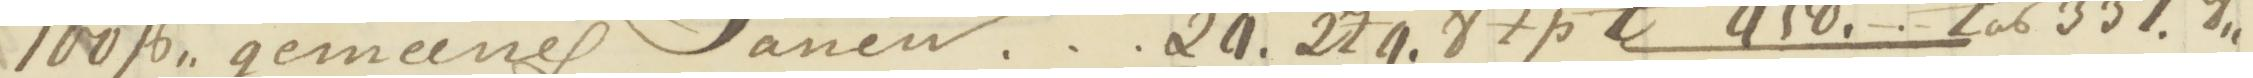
100p„s gemeene Sanen . . . 24. 274. 8 't ps r 450.—.— raso 337.8„
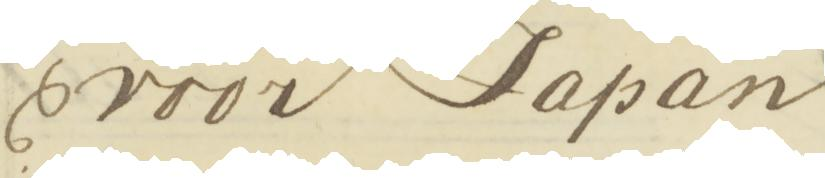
voor Iapan
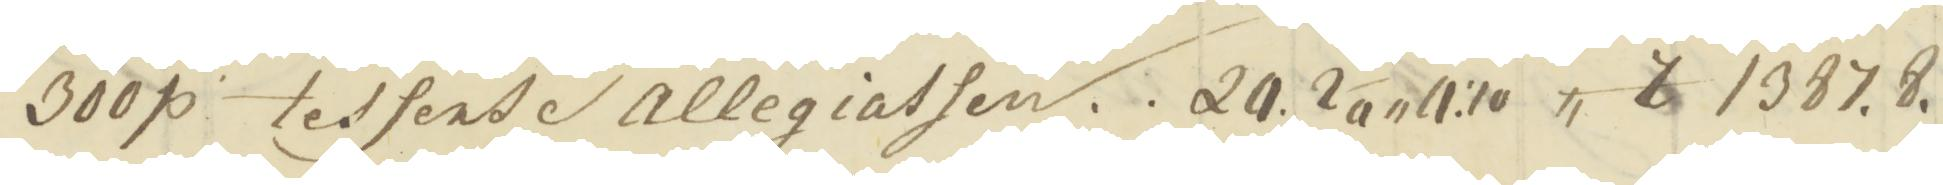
300p:s tesserse Allegiassen.. 24.2¼„4:70 „ t 1387.8.
